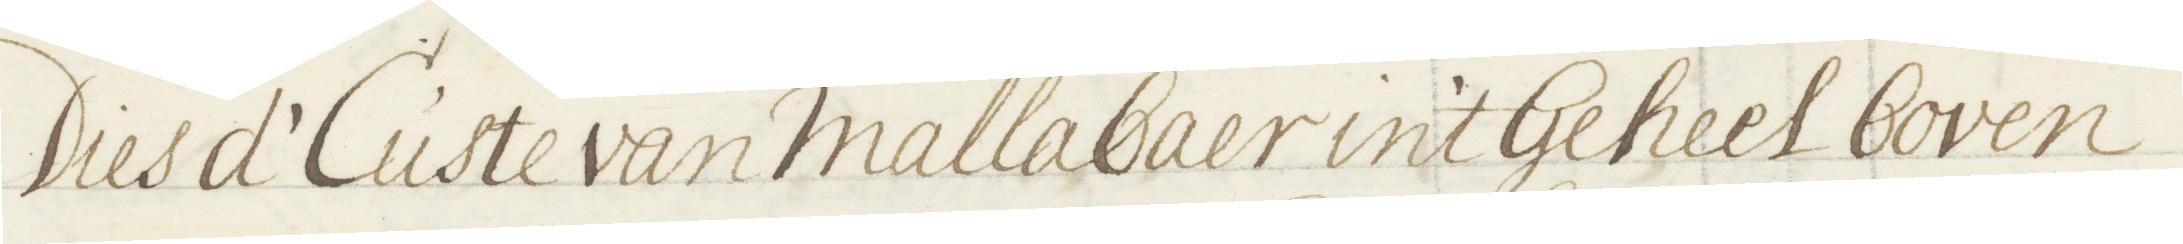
Dies d' Custe van mallabaer in ’t Geheel boven
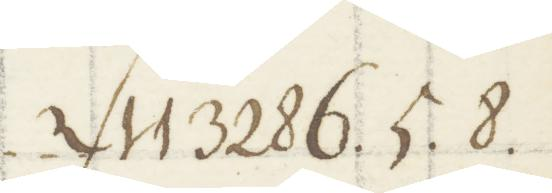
ƒ113286:5:.8.
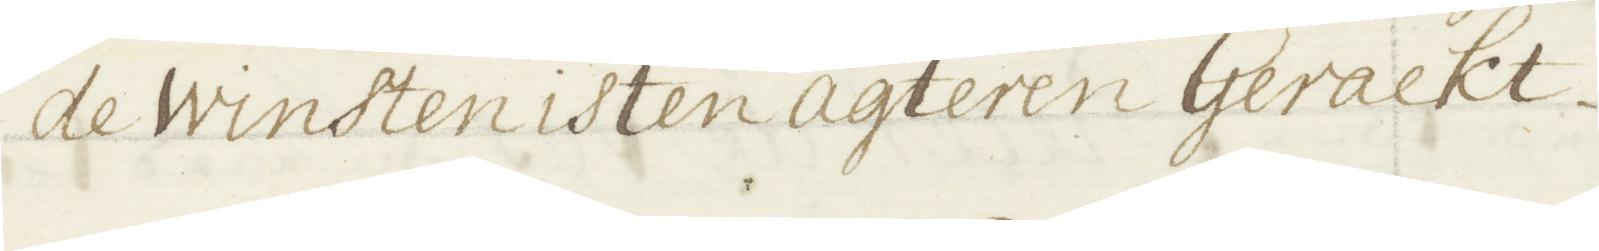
de winsten isten agteren Geraekt.
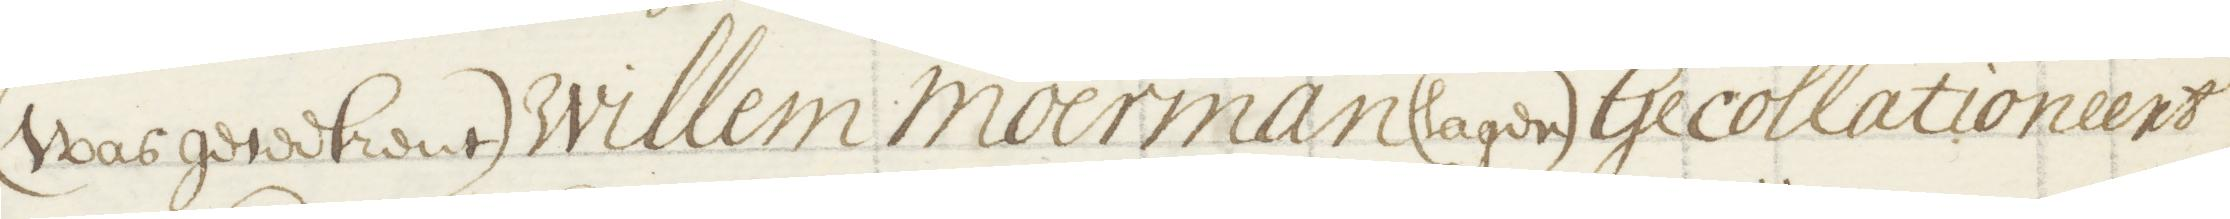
(was geteekent:) Willem Moerman (lager) Gecollationeert
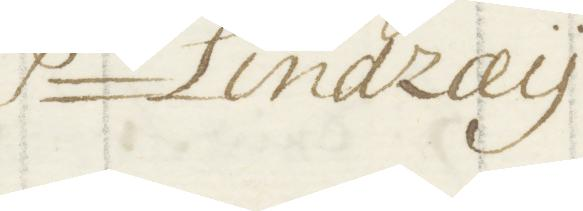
Lindzaij
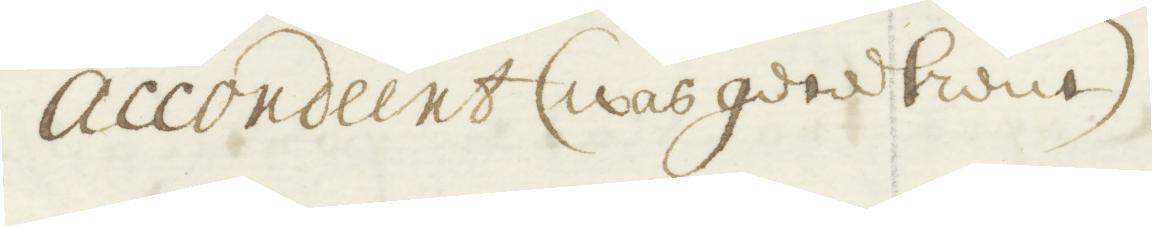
accordeert (was geteekent)
